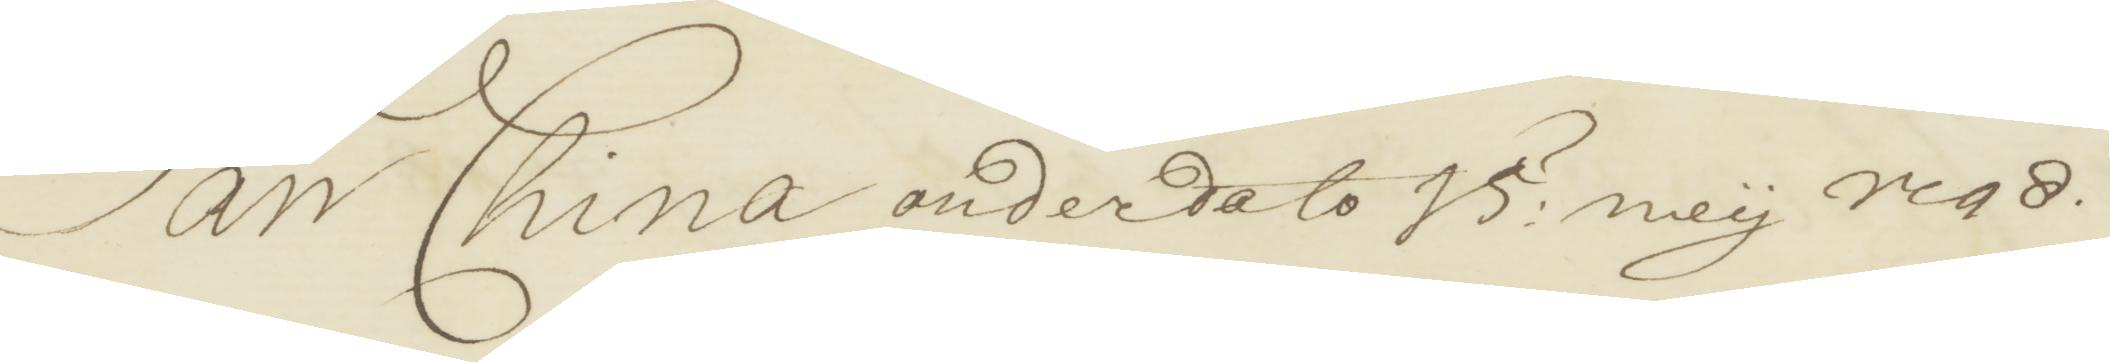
Van China onder dato 15:' meij 1748.
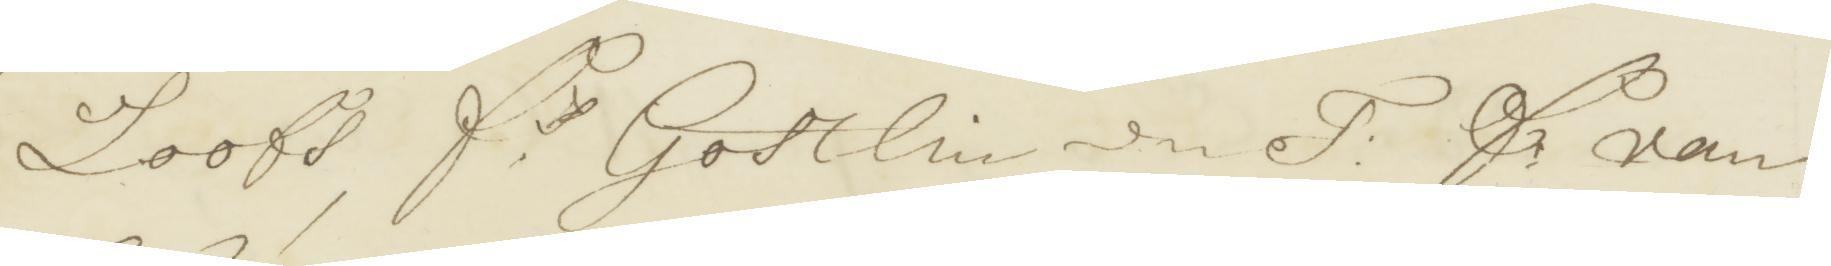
A: Loofs, F,s Gostlin en T: F; van
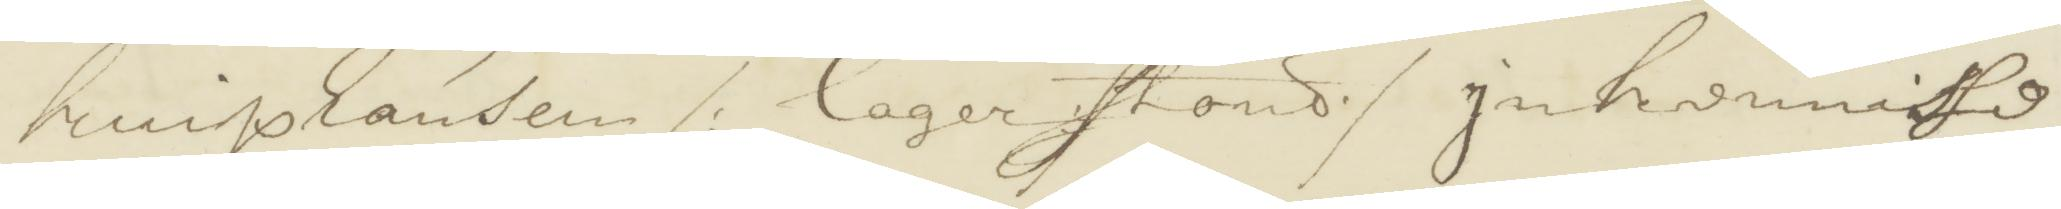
kniphausen /: lager stond:/ jnkennisse
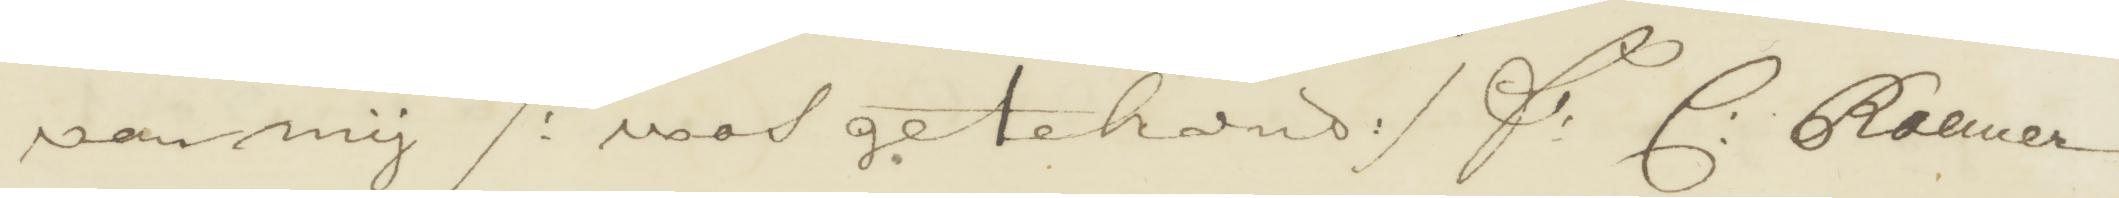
van mij /: was getekend:/ F: C: Roemer
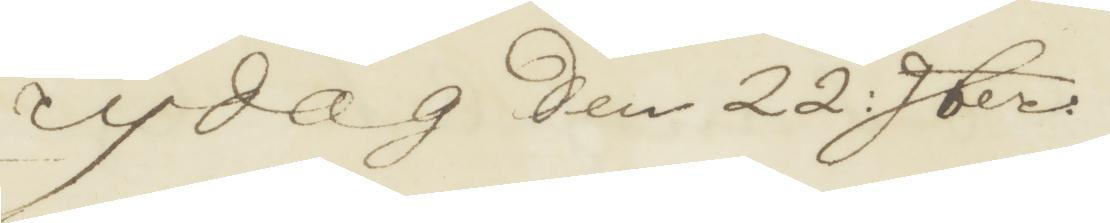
Vrijdag den 22:' Jber:
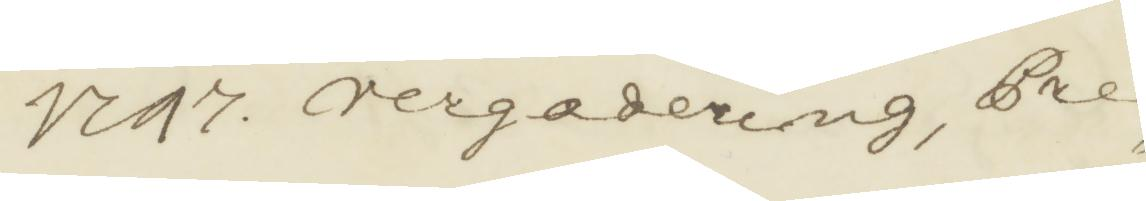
1747. vergadering, Pre„
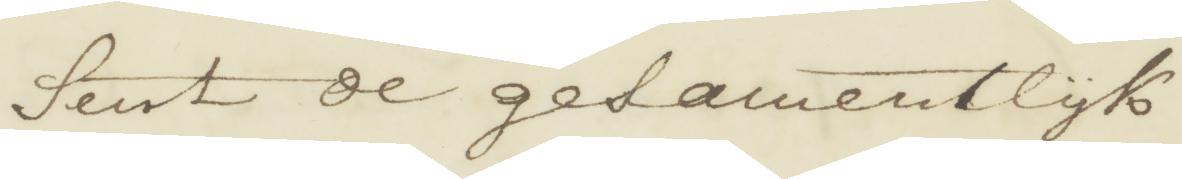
sent de gesamentlijk
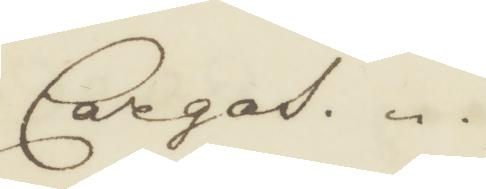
Cargas. _ .
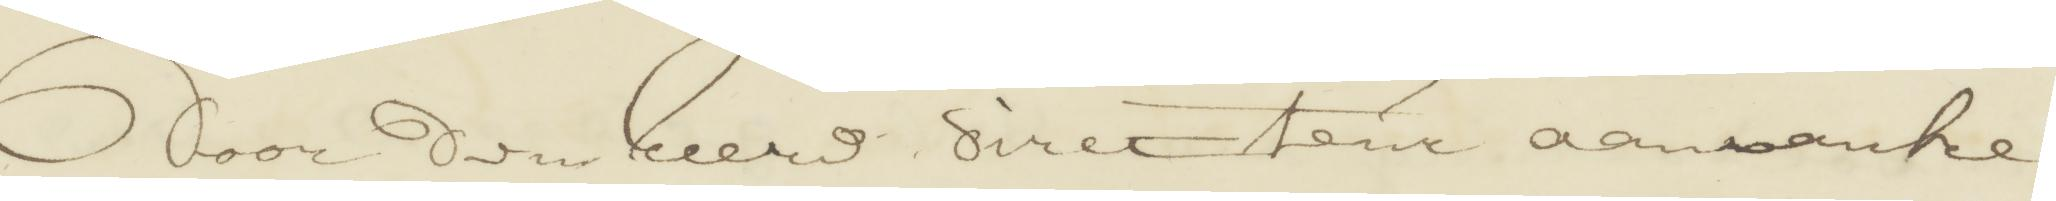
door den heere directeur aanvanke
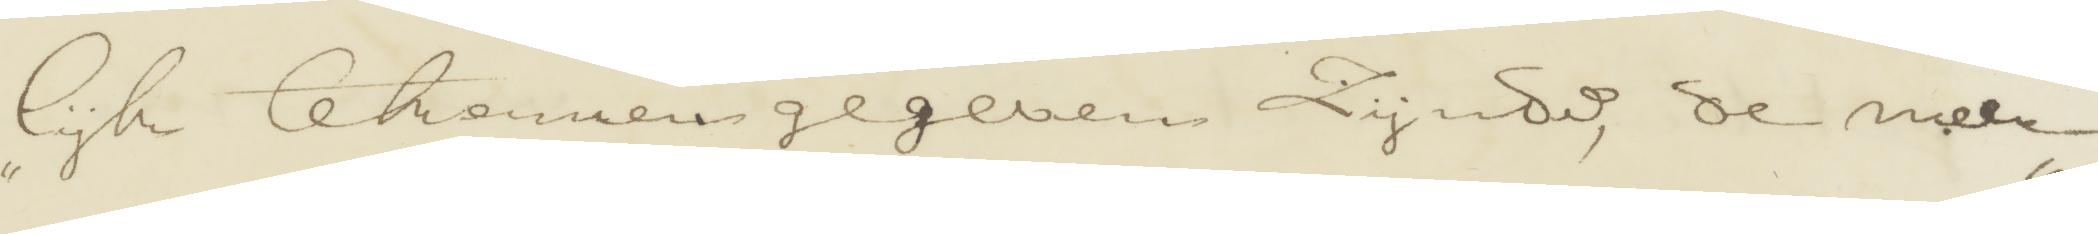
„lijk tekennen gegeven zijnde, de meer
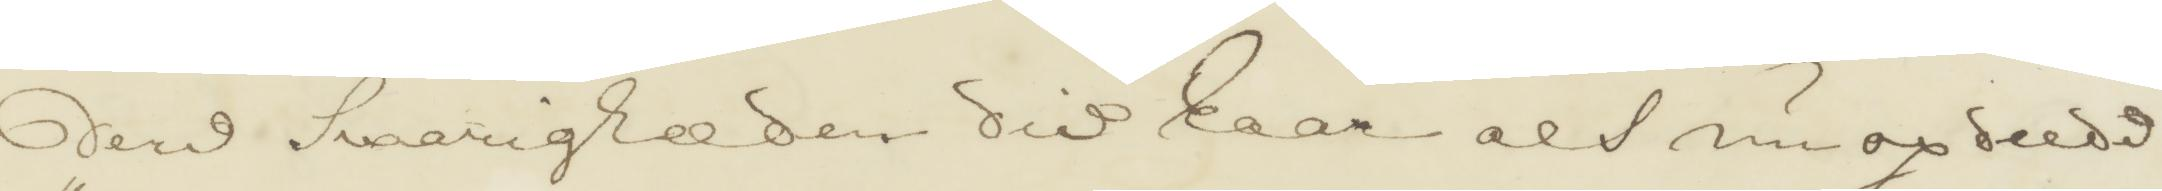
dere swarigheeden die haar als nu op deede,
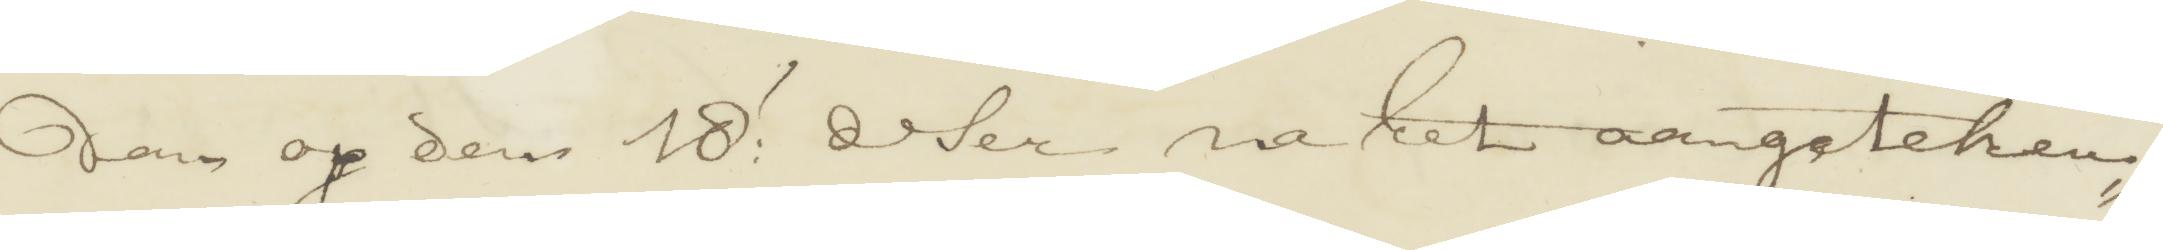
dan op den 18:' deser na het aangeteken„
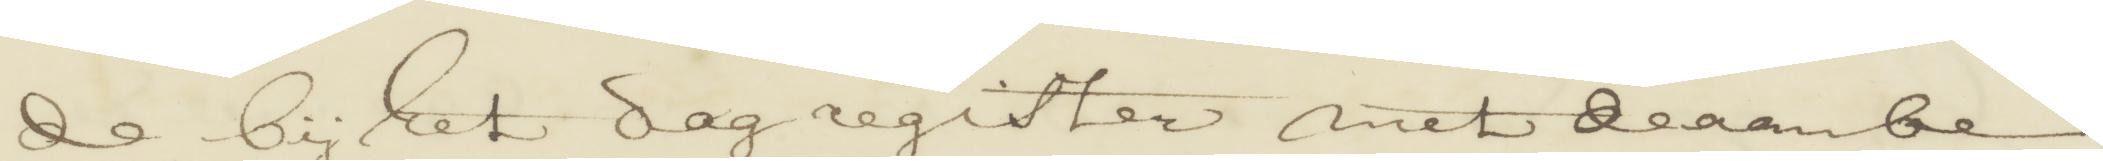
de bij het dag register met de aanbe
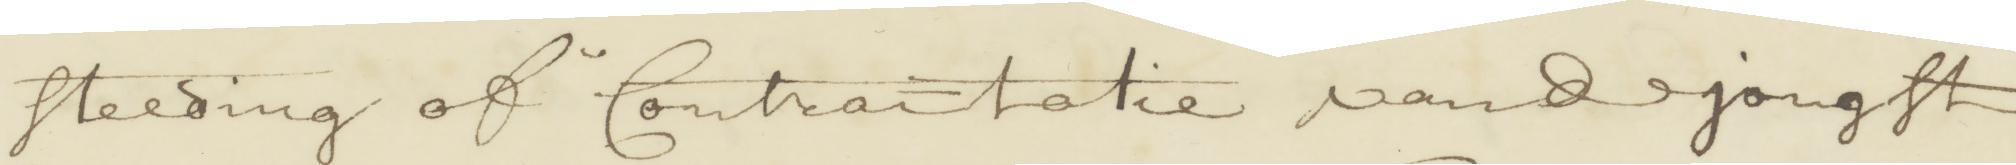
steeding of Contractatie van de jongst
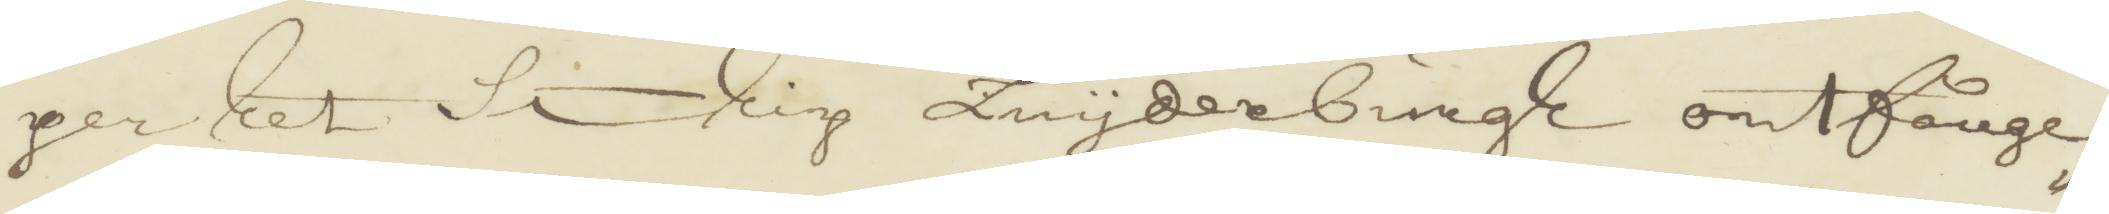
per het schip Zuijderburgh ontfange„
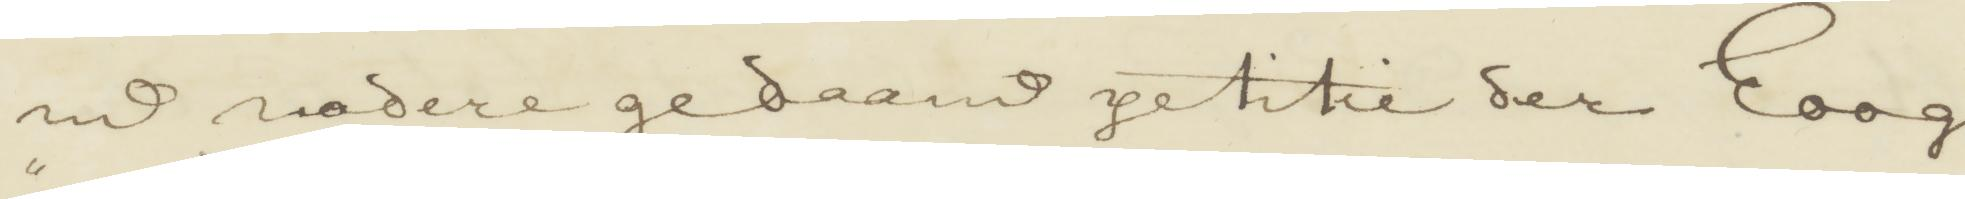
ne nadere gedaane petitie der hoog
